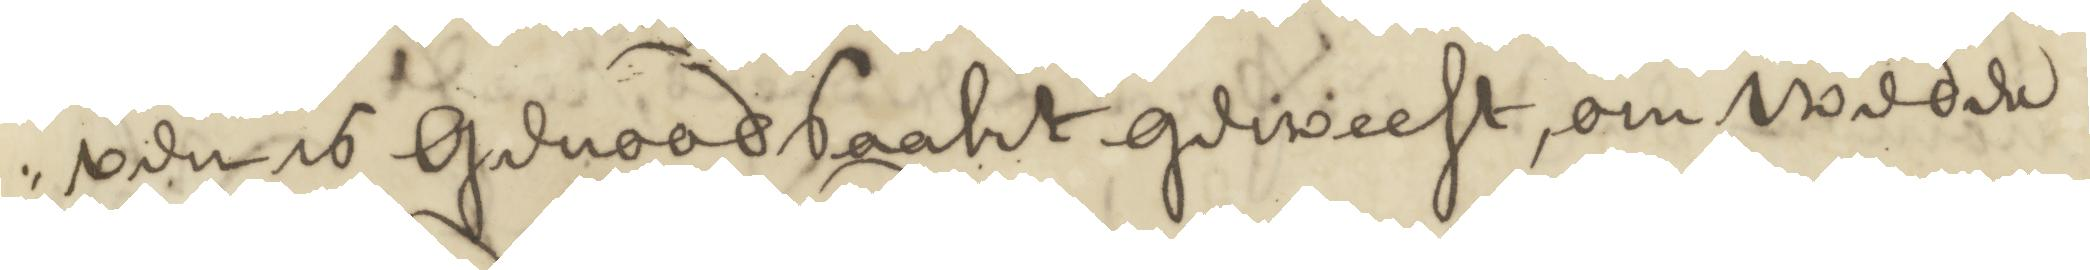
„ven is genoodsaakt geweest, om weder
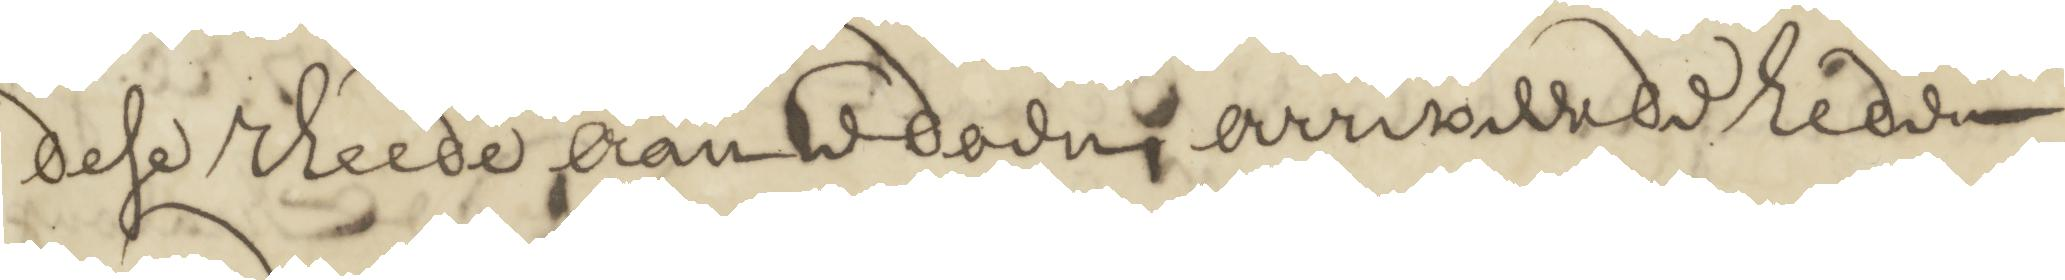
dese rheede, aan te doen, arriveerde heden
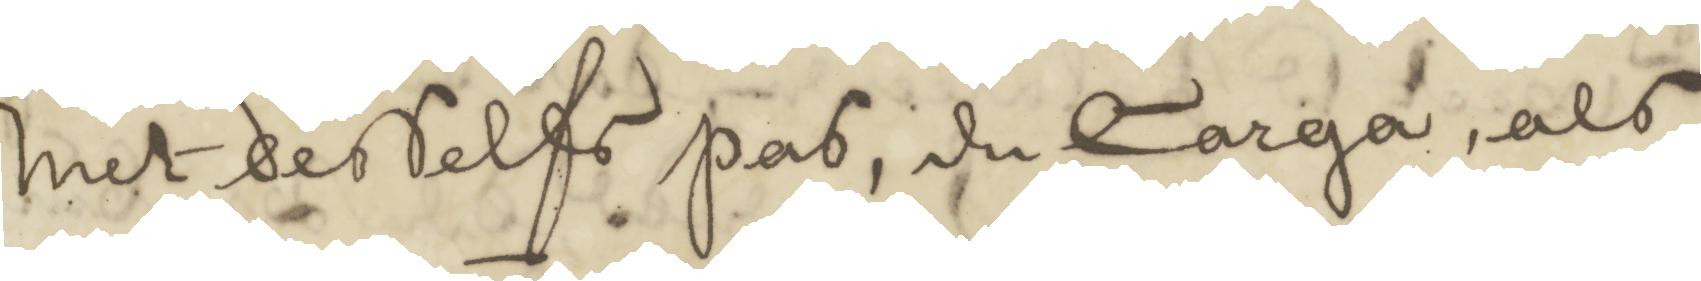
met desselfs pas, en Carga, als
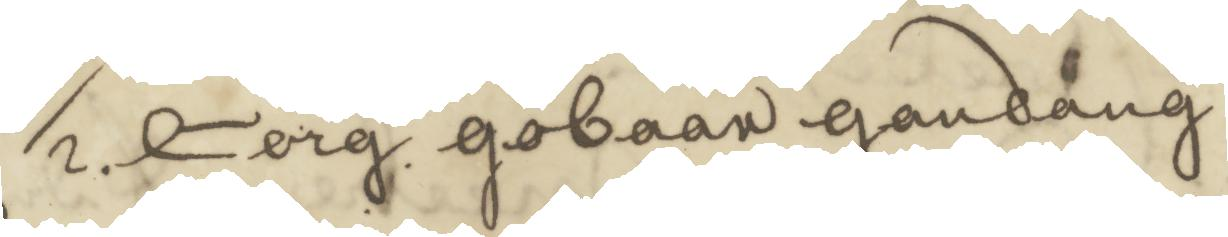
½. Corg. gobaar gandang
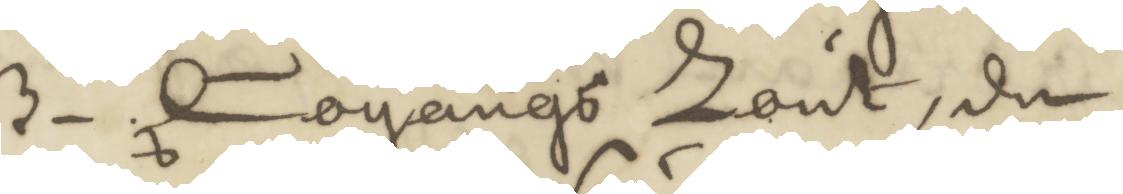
3–. Coijangs Zout, en
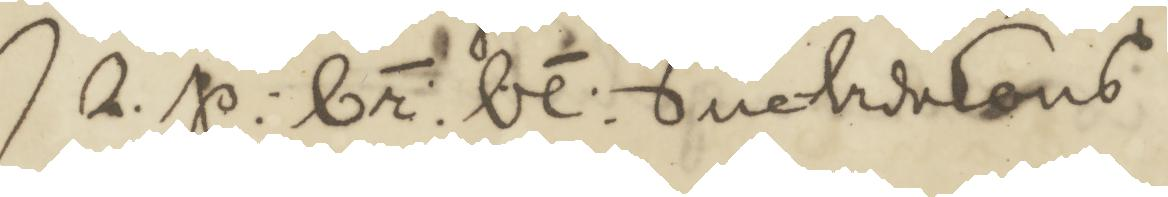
2. p:s br: bl: Suckertons
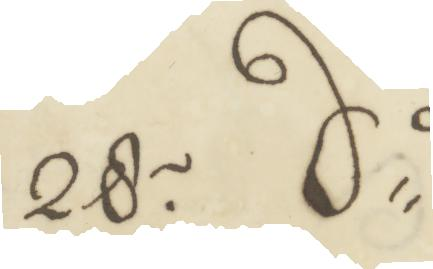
28:' d„o
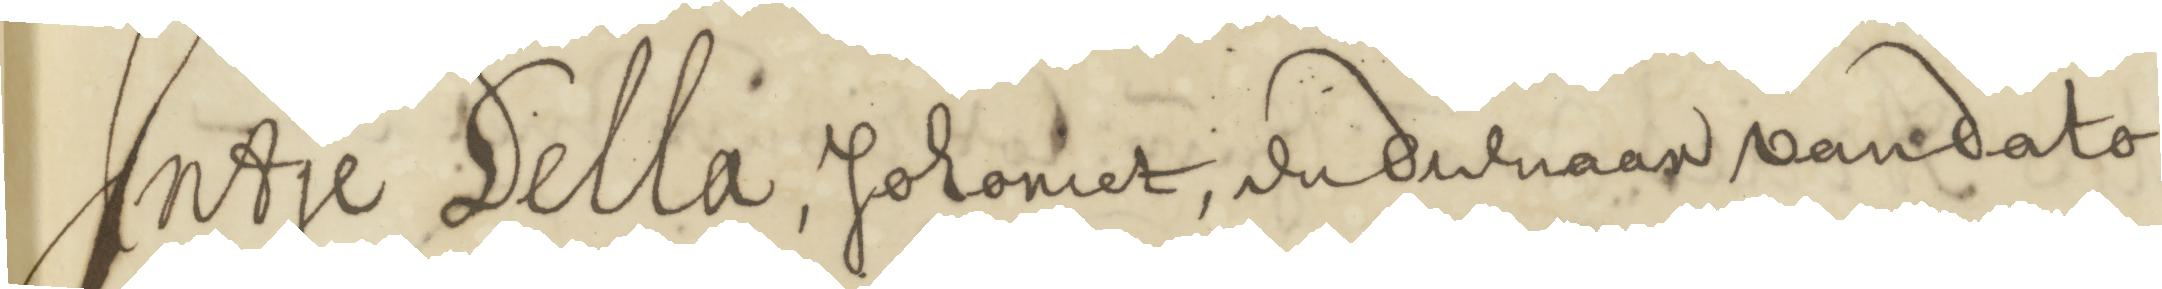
Jntje Della, Johoriet, en dienaar van dato
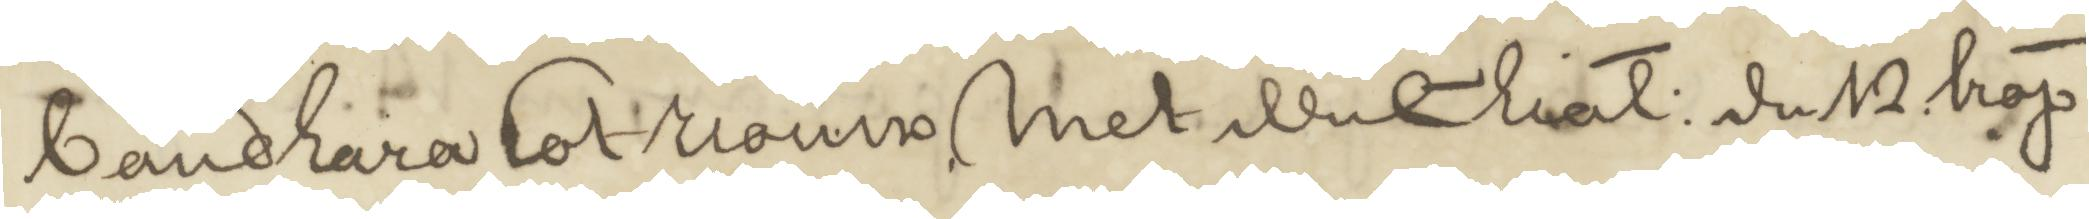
bandhara tot riouw Met een Chial: en 12. kop
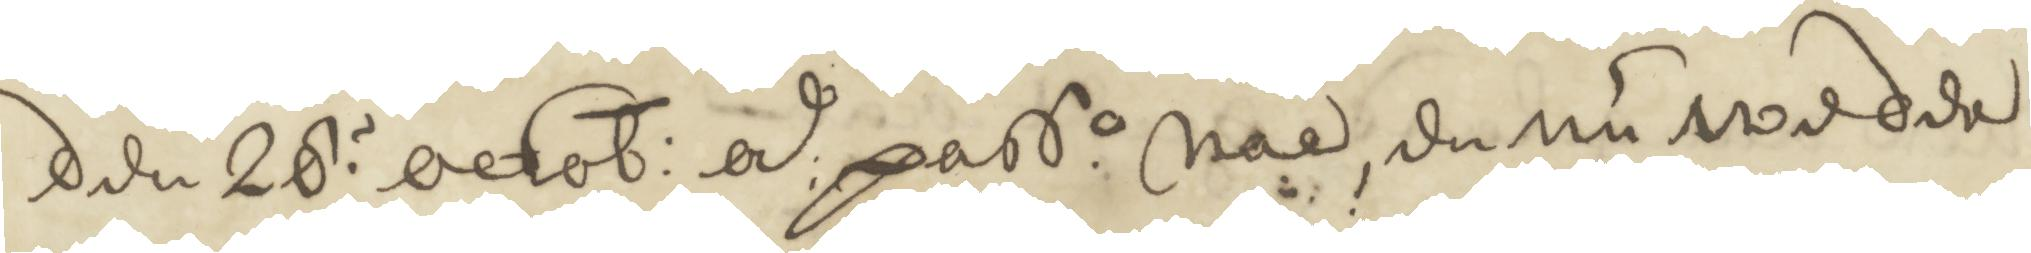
den 28:' octob: a:o pass:o nae, en nu weder
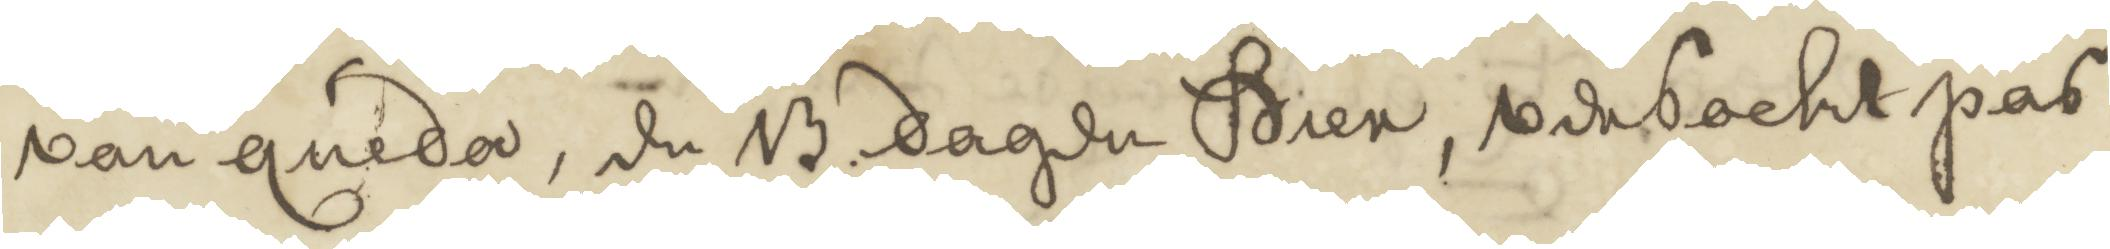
van queda, en 13. dagen Hier, versoekt pas
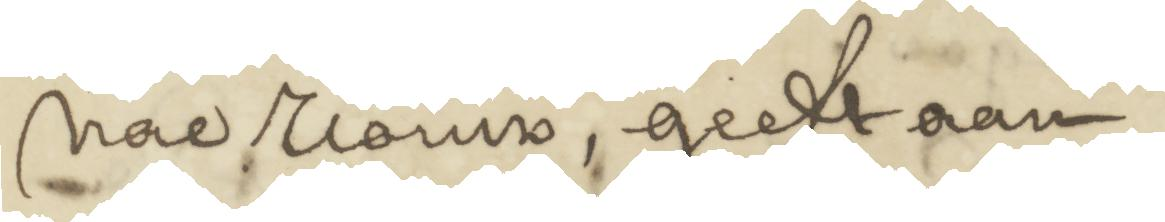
nae riouw, geeft aan
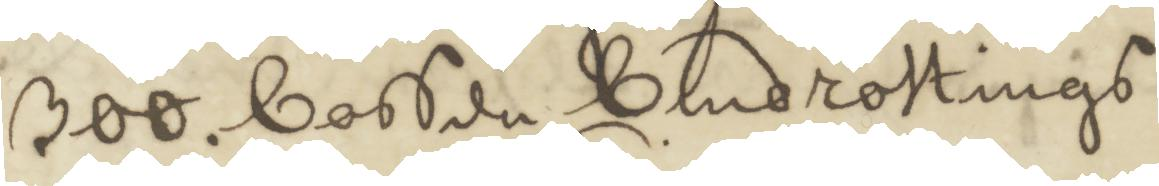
300. bossen bindrottings
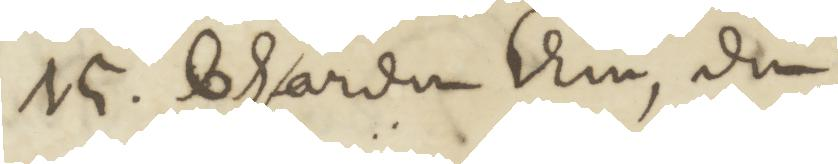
15. bharen thin, en
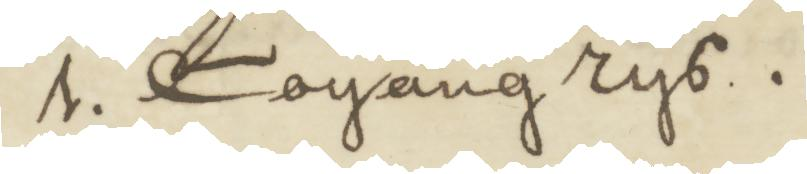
1. Coijang rijs.
